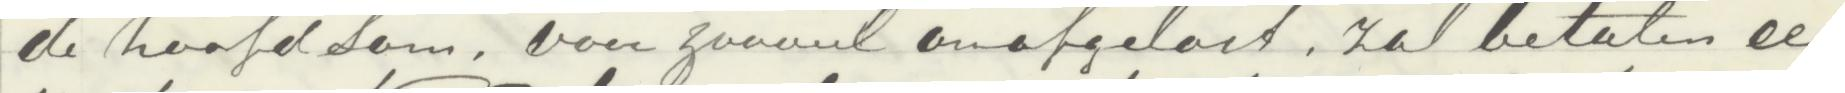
de hoofdsom, voor zooveel onafgelost, zal betalen een
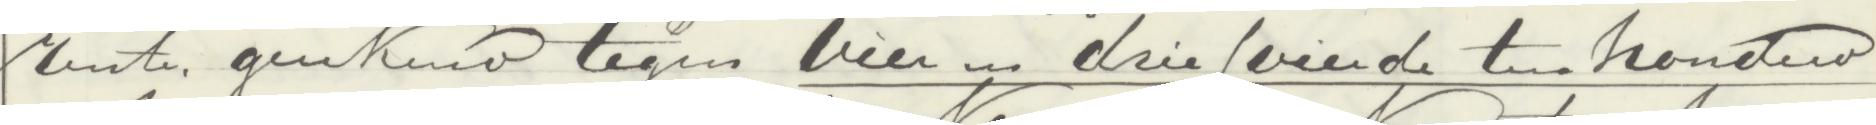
rente, gerekend tegen Vier en drie/vierde ten honderd
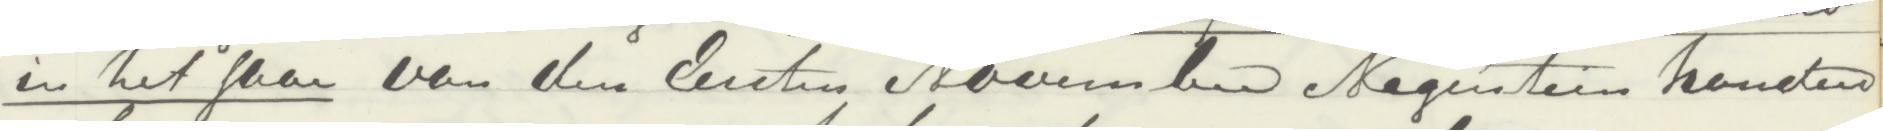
in het jaar van den Eersten November Negentien honderd
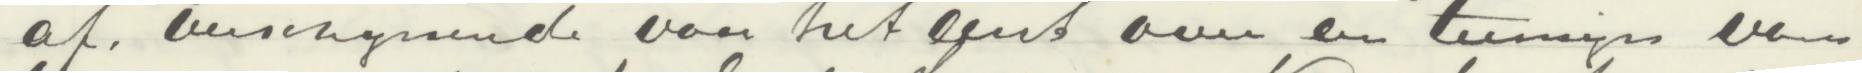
af, verschynende voor het eerstover een termijn van
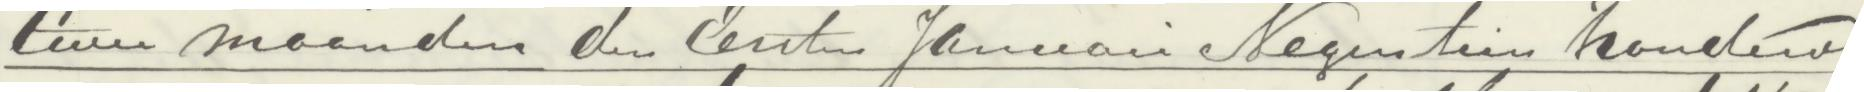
twee maanden den Eersten Januari Negentien honderd
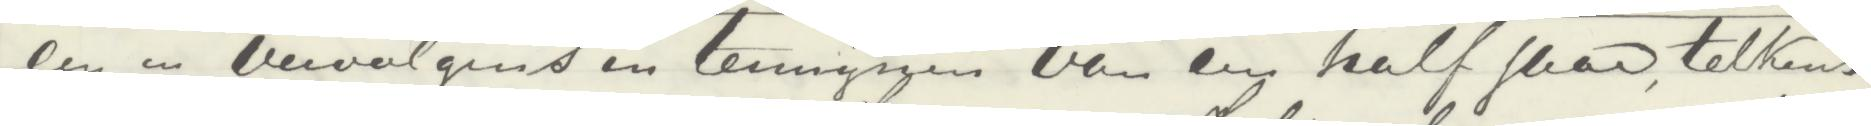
een en vervolgens in termijnen van een half jaar, telkens
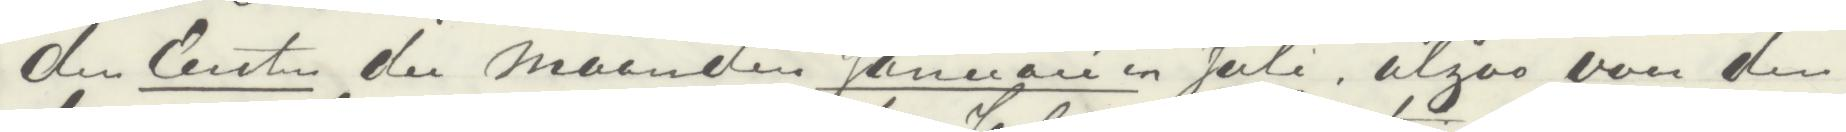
den Eersten der maanden Januari en Juli, alzoo voor den
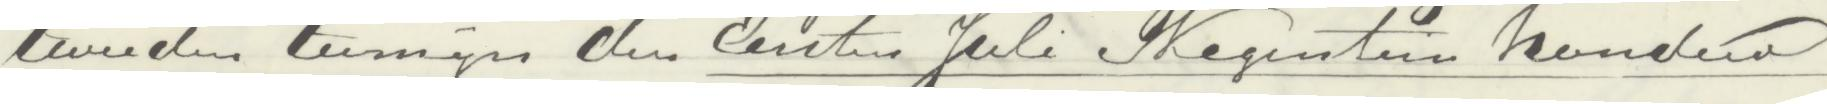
tweeden termijn den Eersten Juli Negenten honderd
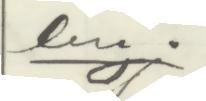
een.
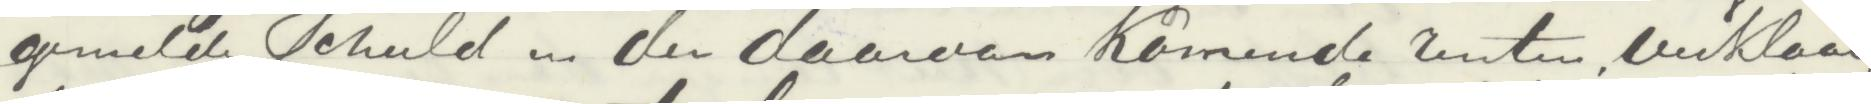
gemelde schuld en den daarvan komende renten, verklaar
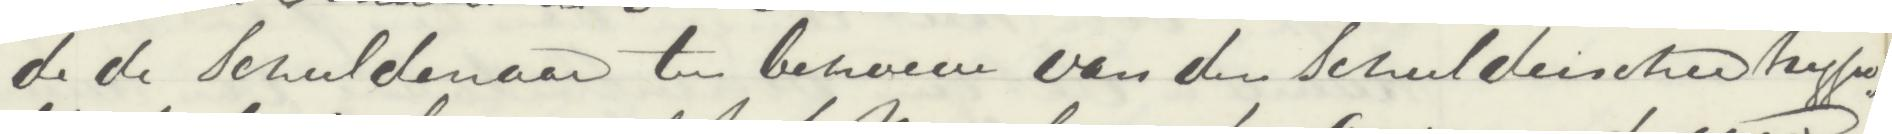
de de schuldenaar ten behoeve van den schuldeischer hypo„
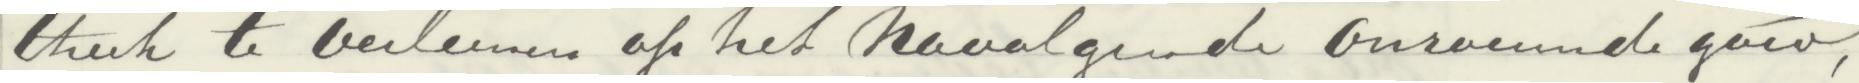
theek te verleenen op het navolgende Onroerende goed,
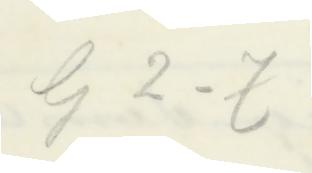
G 2 - 7
